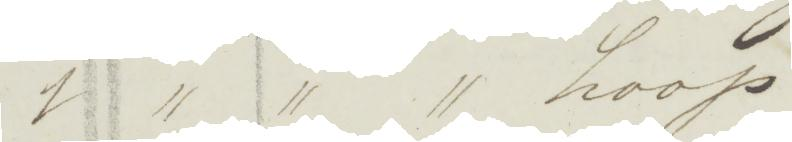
1 „ „ „ hoop
